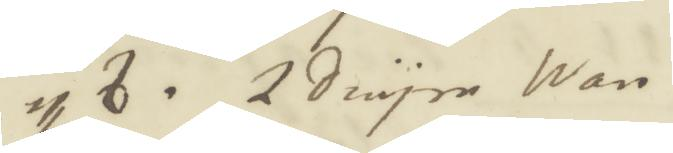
„ 8 . 2 duijm wan
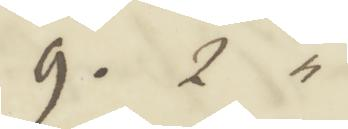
9 . 2 „
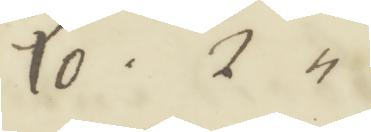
10 . 2 „
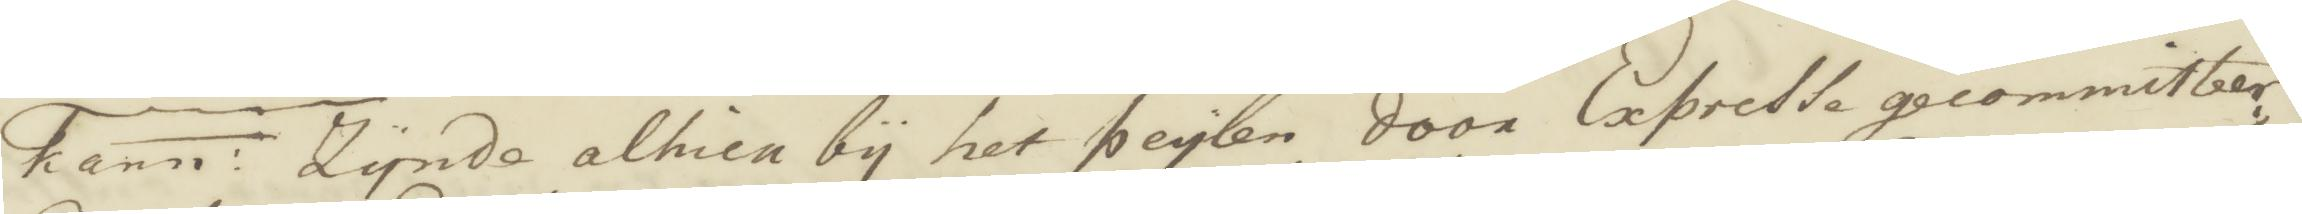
kann: zijnde alhier bij het peijlen door Expresse gecommitteer„
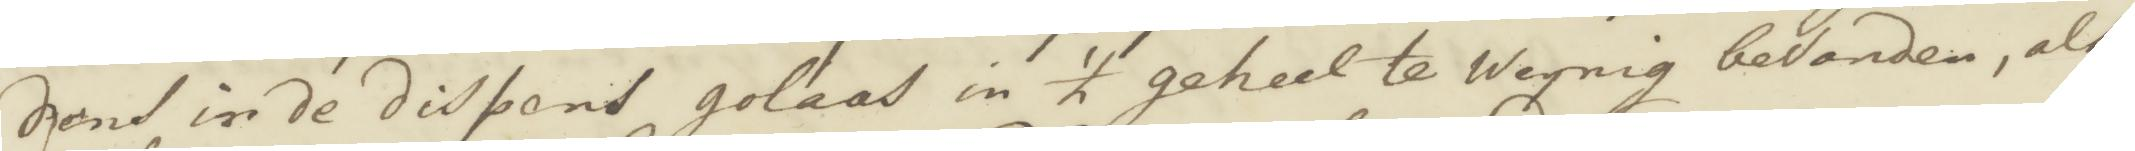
dens in de dispens golaas in ’t geheel te weynig bevonden, als
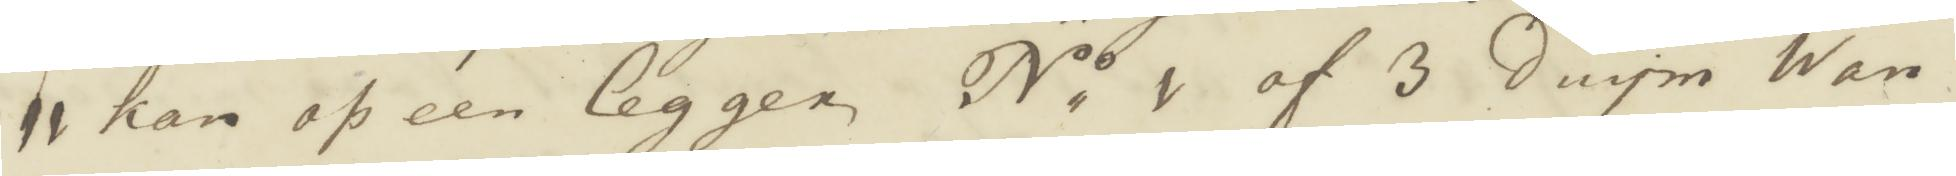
11 kan op een legger N„o 1 of 3 duijm wan
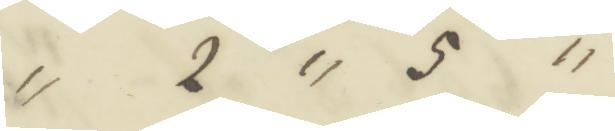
„ 2 „ 5 „
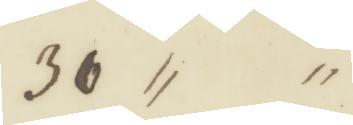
30 „ „
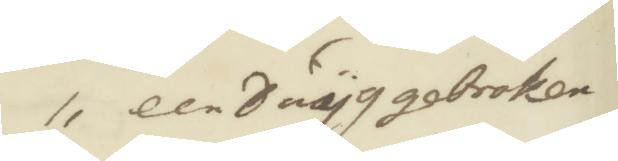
„ een duijg gebroken
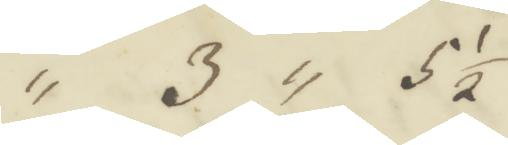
„ 3 „ 5½
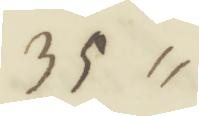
35 „
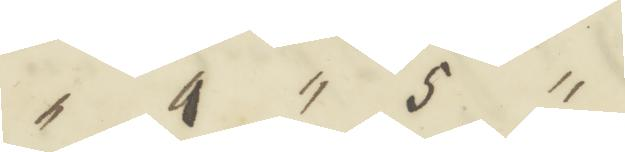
„ 4 „ 5 „
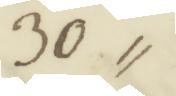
30 „
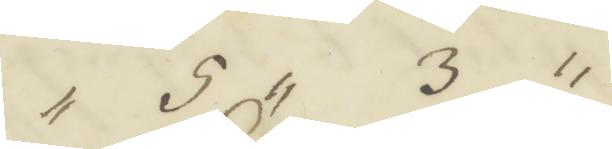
„ 5 „ 3 „
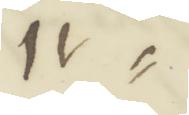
11 „
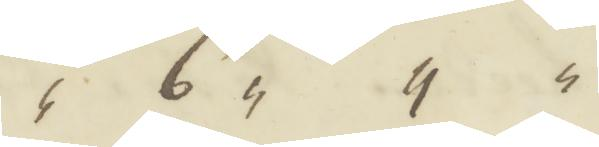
„ 6 „ 4 „
